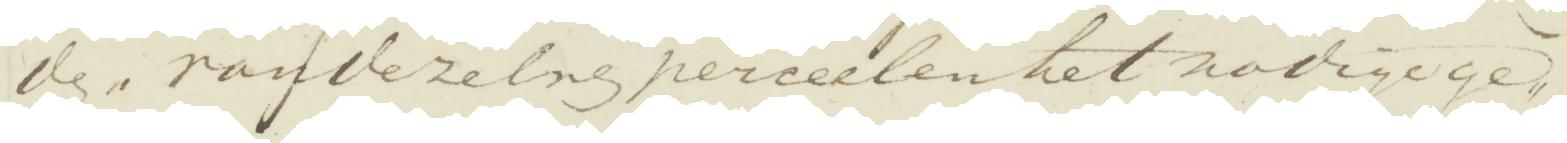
de, van dezelve perceelen het nodige ge„
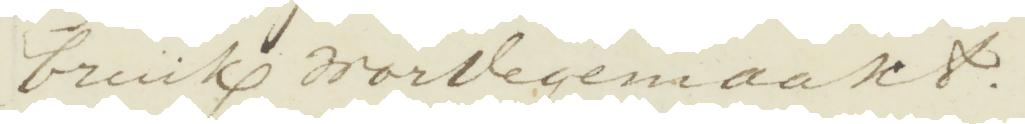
bruik worde gemaakt.
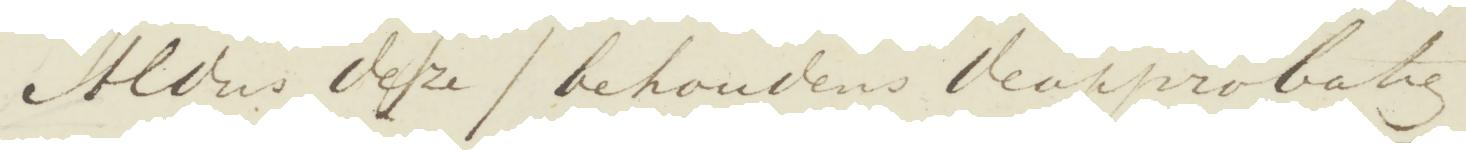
Aldus deze / behoudens de approbatie
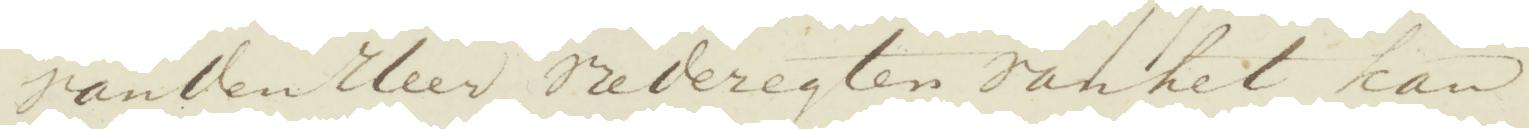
van den Heer Vrederegten van het kan
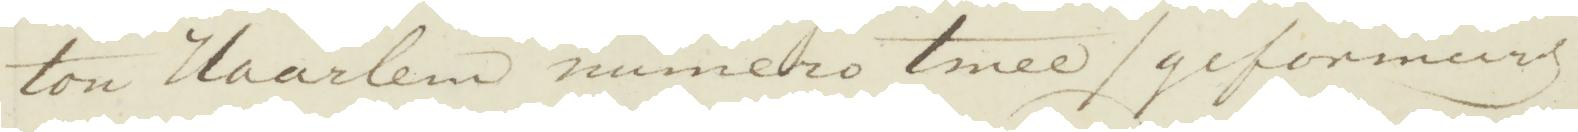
ton Haarlem numero twee / geformeerd
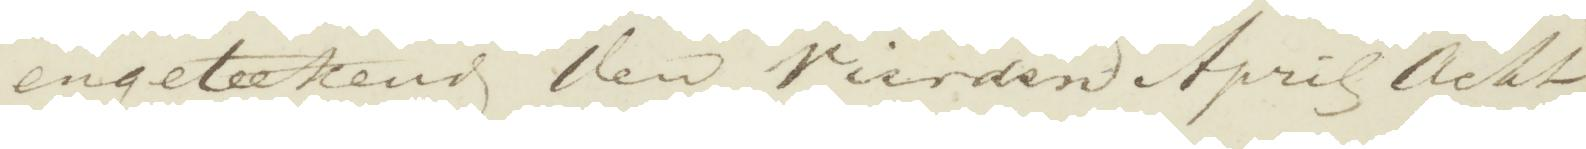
en geteekend den Vierden April Acht
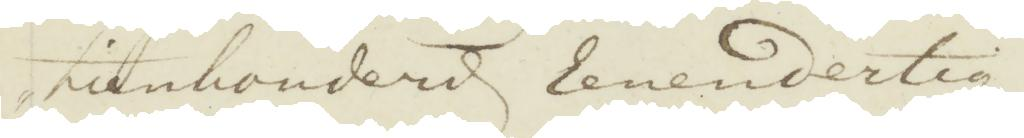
„tienhonderd Eenendertig
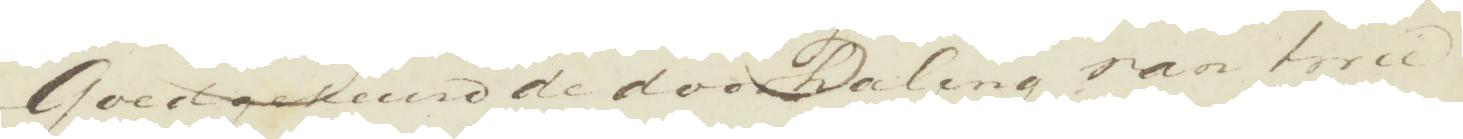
Goedgekeurd de doorhaling van twee
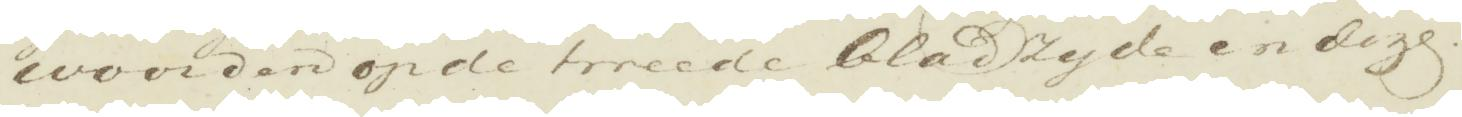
woorden op de tweede bladzyde en deze.
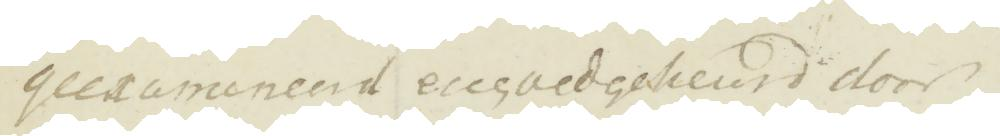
geexamineerd en goedgekeurd door
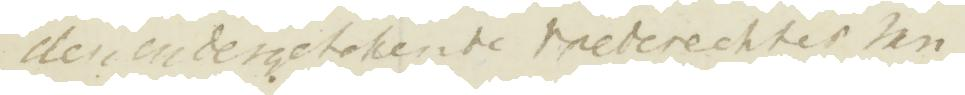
den ondergetekende vrederechter van
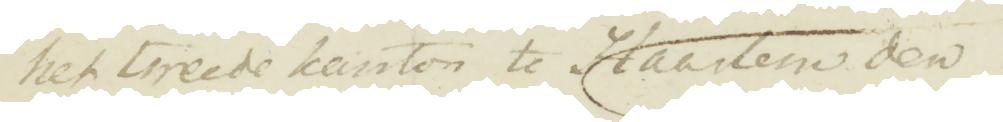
het tweede kanton te Haarlem den
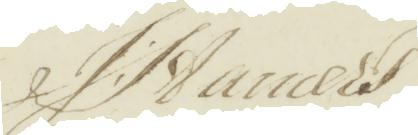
J:S Andes
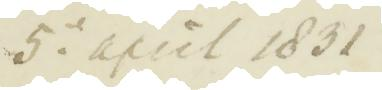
5.e april 1831
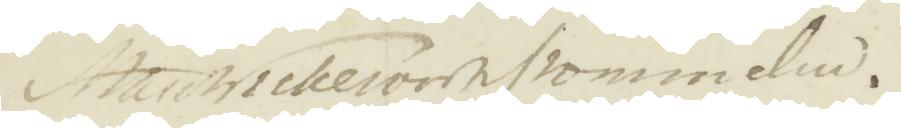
A van Wickevoort Crommelin.
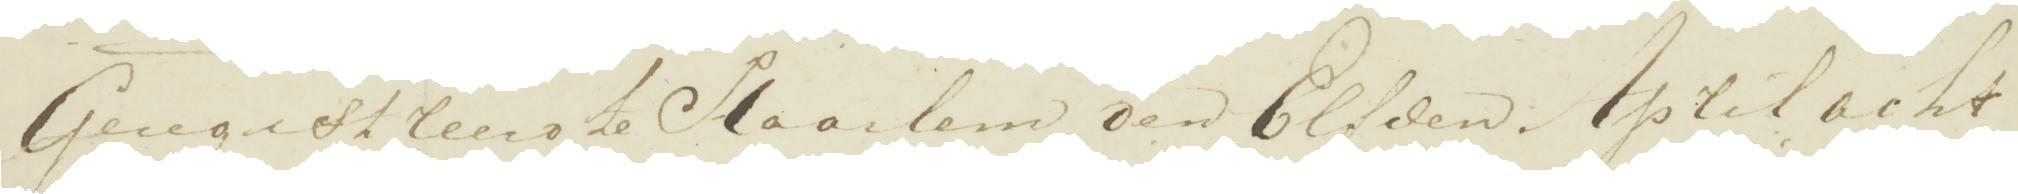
Geregistreerd te Haarlem den Elfden. April acht
